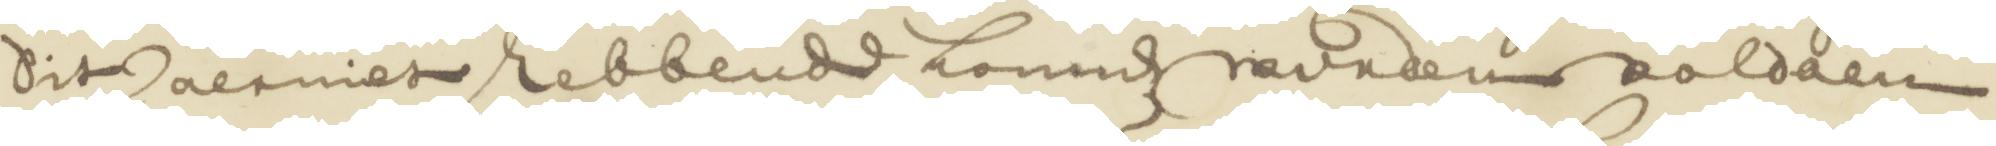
dit Jaer niet hebbende konnen werden voldaen
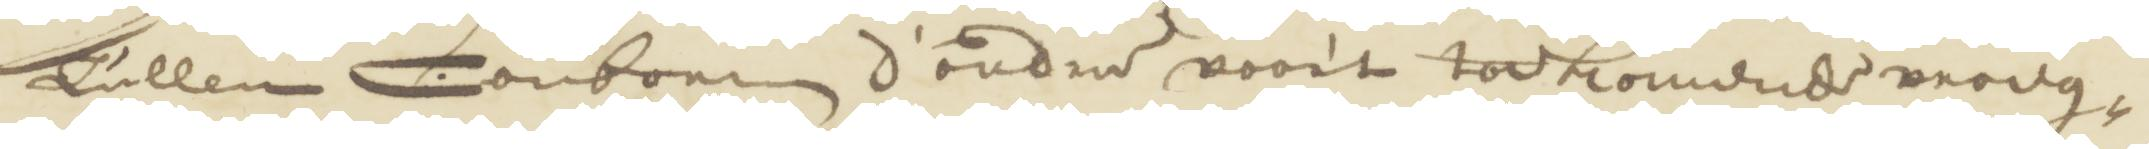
zullen conform d’ordre voor't toekomende vroeg„
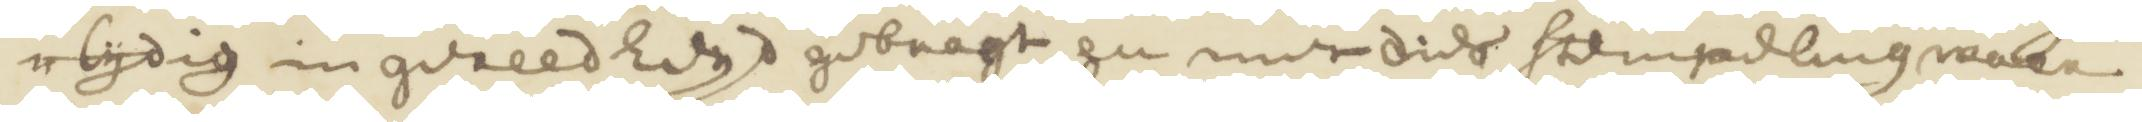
„tijdig in gereedheyd gebragt en met dies stempeling waar
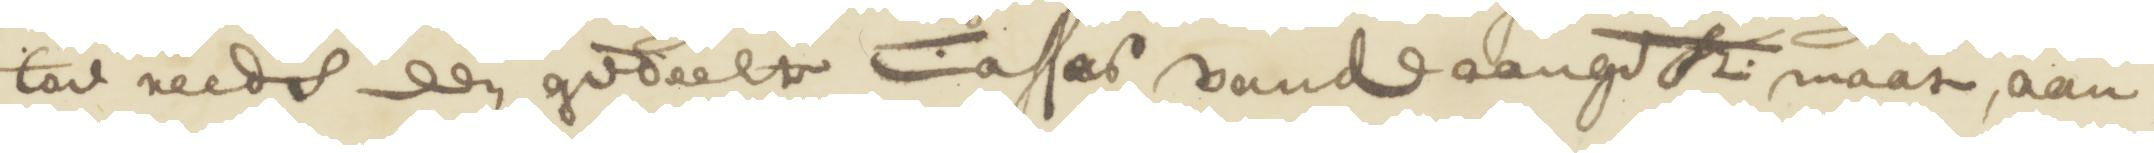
toe reeds een gedeelt Cassas van de aangesz: maat, aan
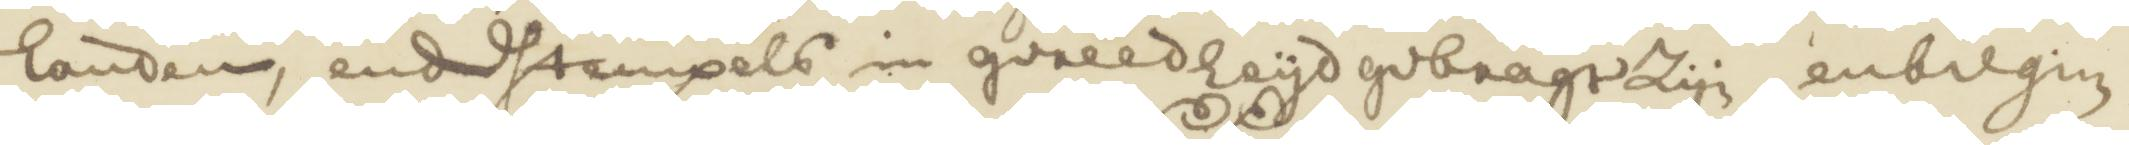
handen, en de stempels in gereedheijd gebragt Zijn en begin
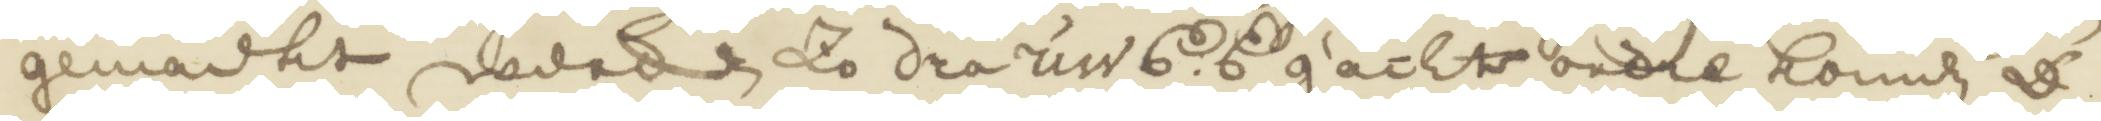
gemaekt werden Zodra uw E:E g’achte ordre komen te
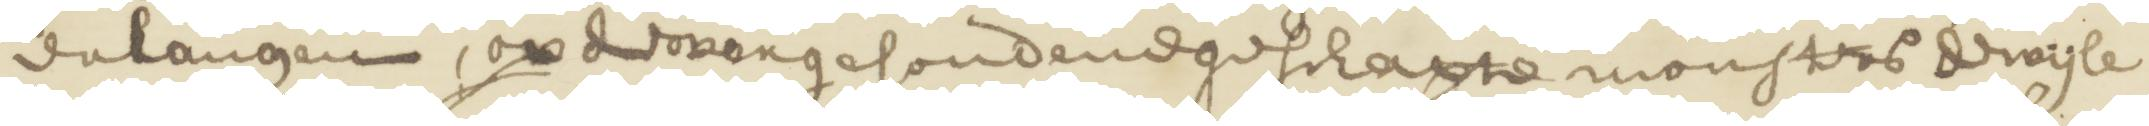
erlangen, op de overgesondene geschapte monsters dewijle
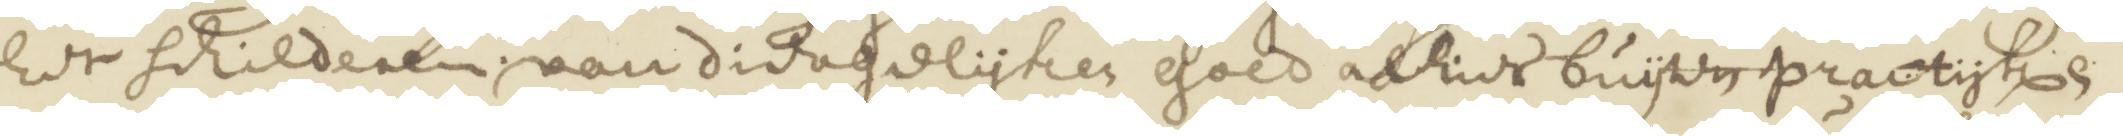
het schilderen van diergelijken goed alhier buijten practijke
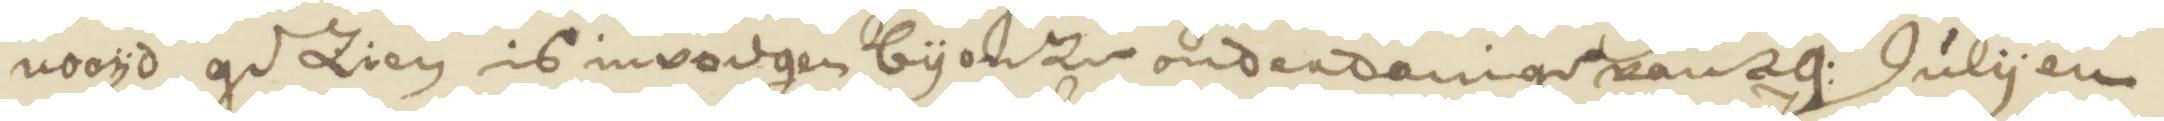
nooijd gezien is invoegen bij onze onderdanige van 29: Julij en
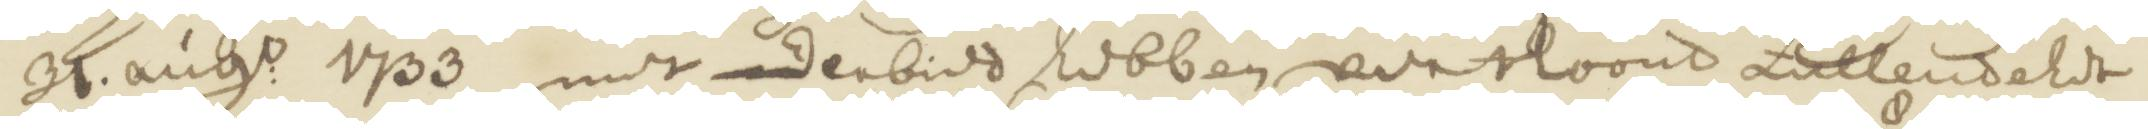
31. aug:o 1733 met eerbied hebben verthoond Zullende het
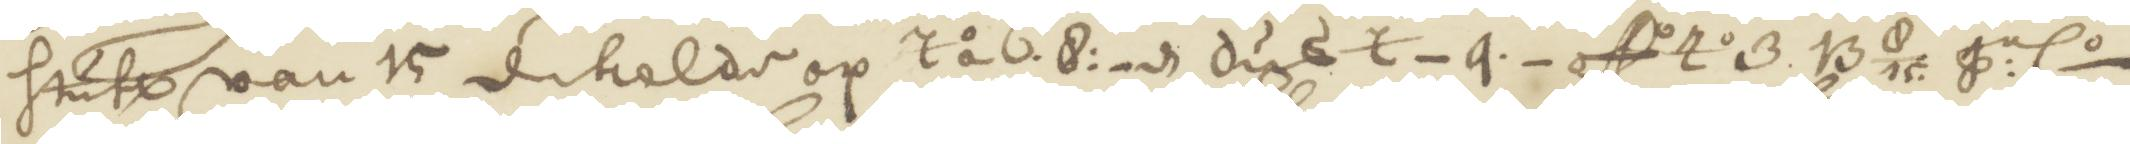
stuk van 15 Enkelde op r=o/a 6.8:- en dus r -4.- of r:o 3. 13 8/15: p:r C=o
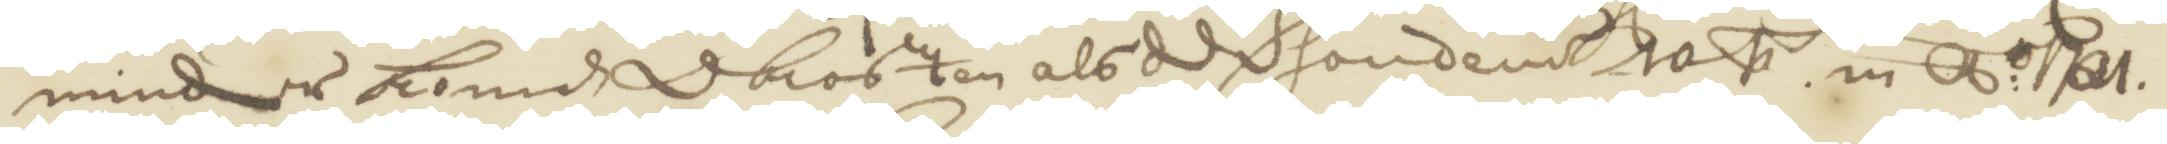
minder komen te kosten als de versonden tot: in A:o 1721.
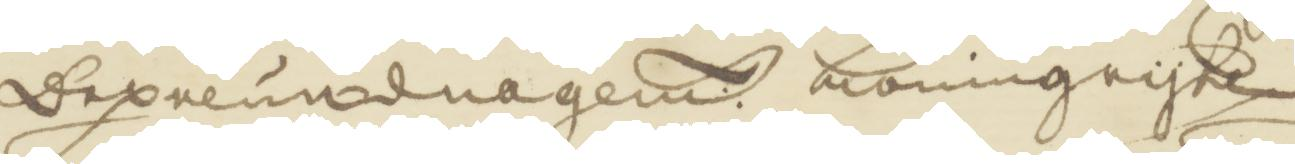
Ter preuwe na gem: koningrijk
